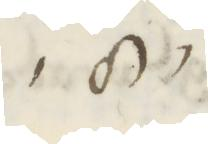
/ 8 /
